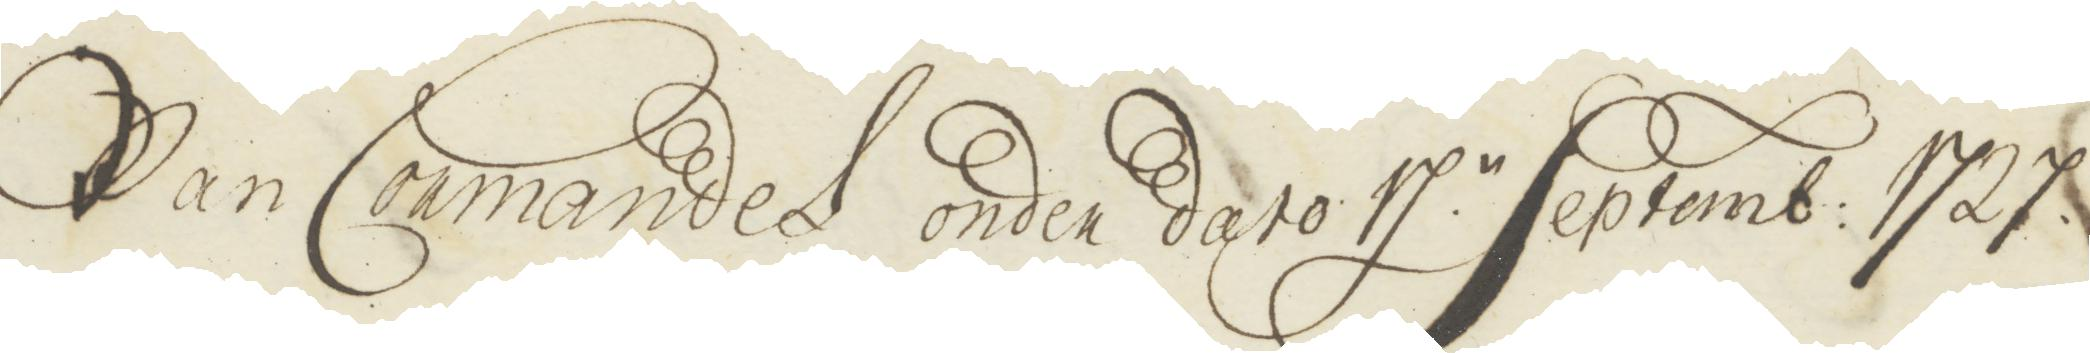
Van Cormandel onder dato 17.' Septemb: 1727.
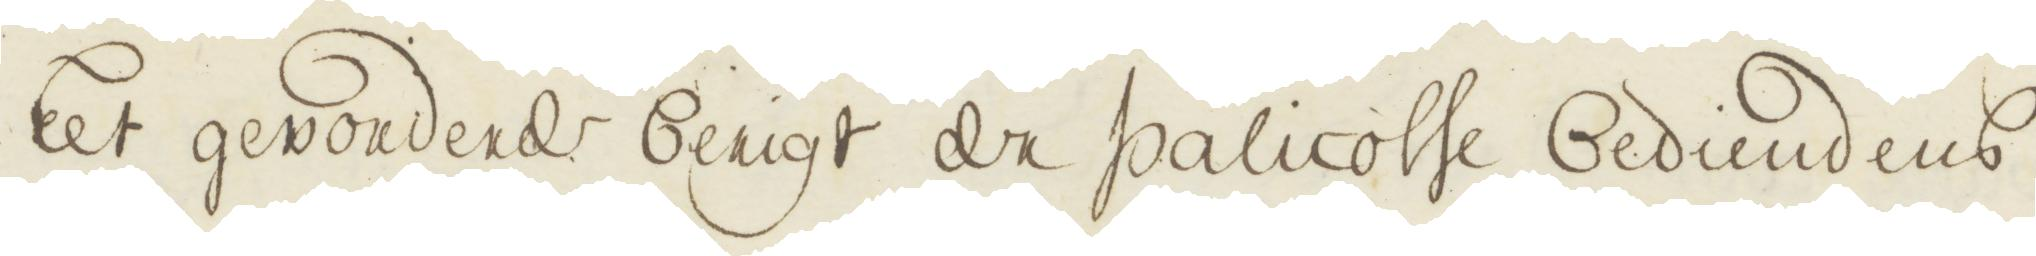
het gevorderde berigt der palicosse bediendens
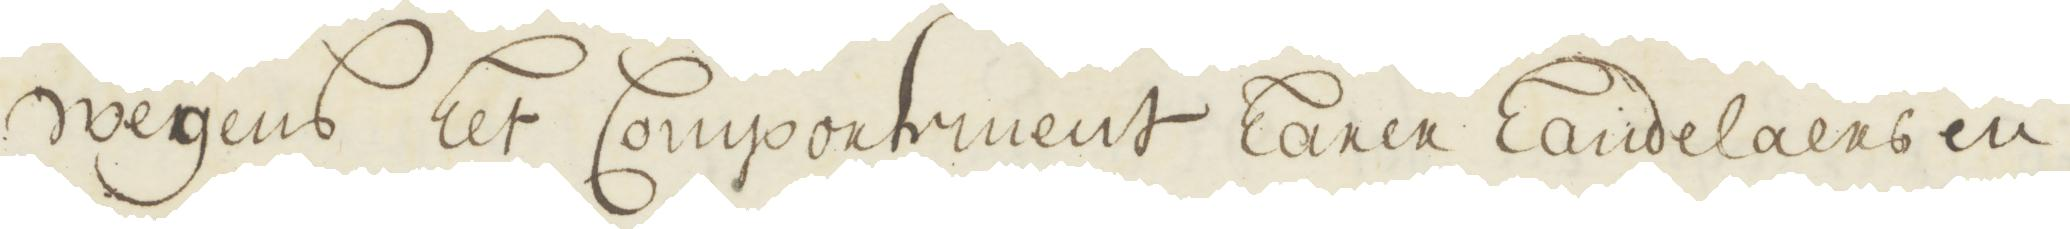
wegens het Comportement harer handelaers en
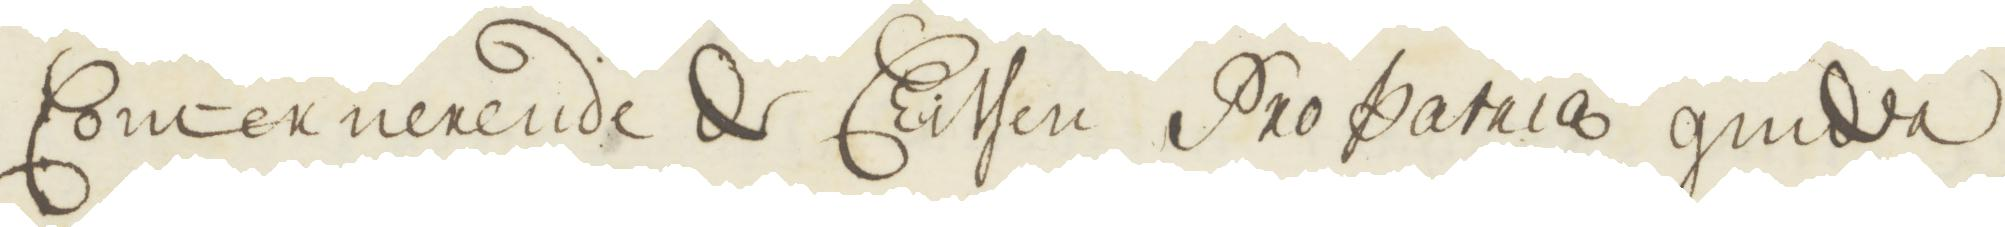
Concernerende de Chitsen Pro patria ginder
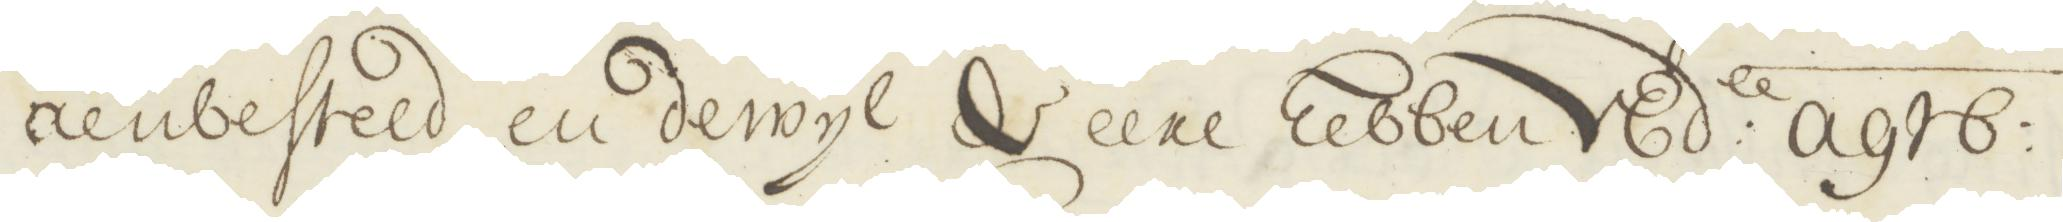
aenbesteld en dewijl de eere hebben VEd:le agtb:
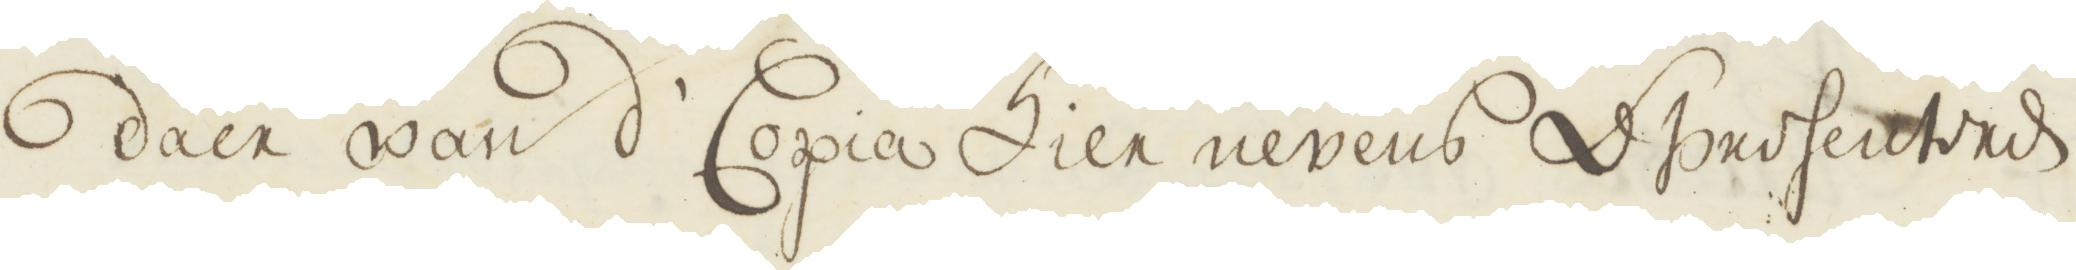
daer van d’ Copia hier nevens te presenteren
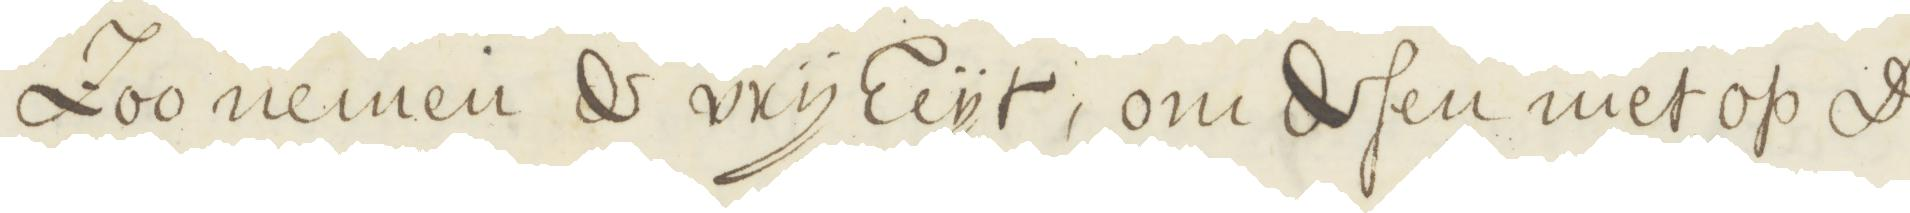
Zoo nemen de vrijheijt; om desen niet op te
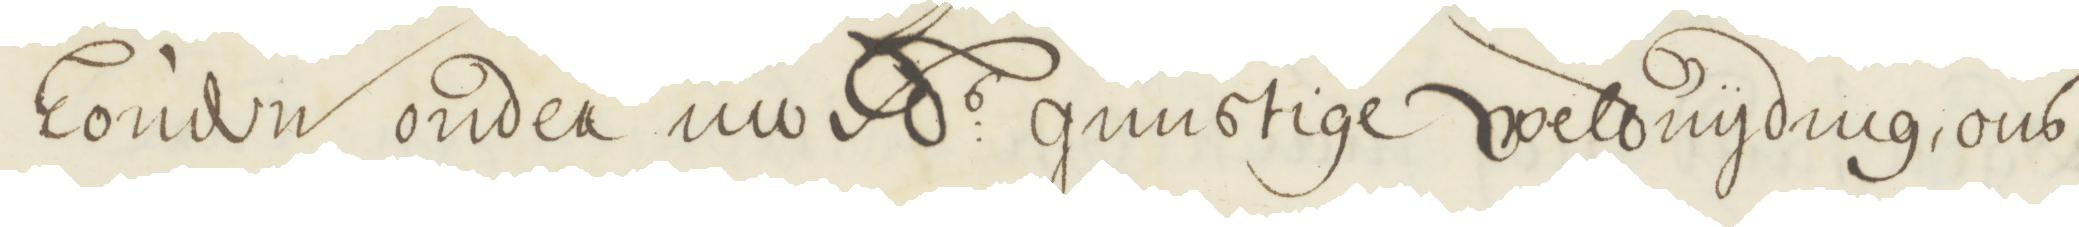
houden onder uw Ed:s gunstige welduijding, ons
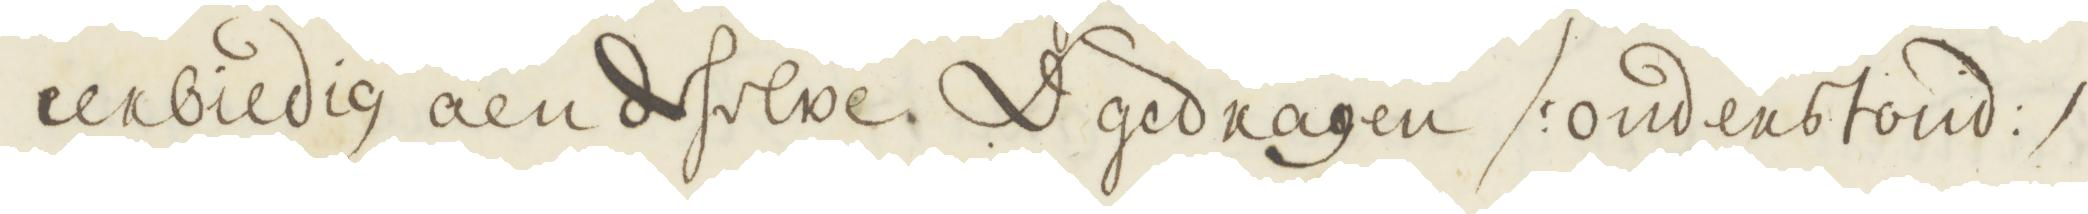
eerbiedig aen deselve te gedragen /:onderstond :/
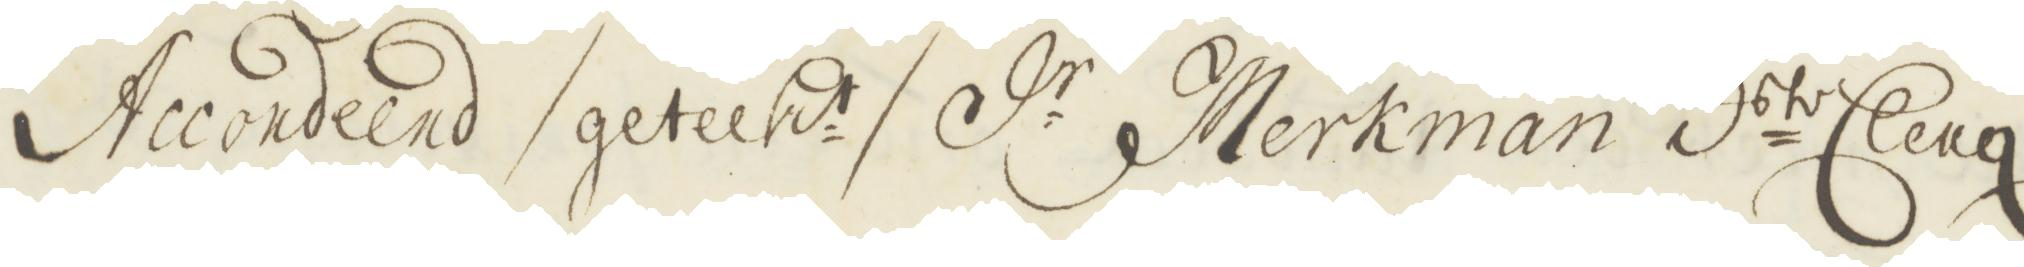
Accordeerd /geteek=t/ I:r Merkman E=ste Clerq
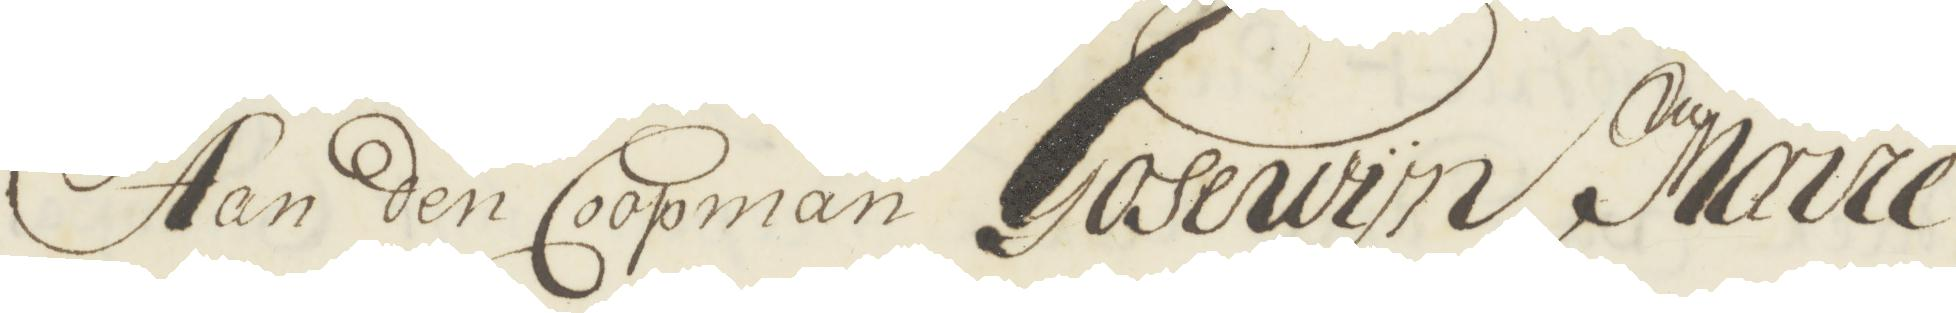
Aan den Coopman Gosewijn Maire
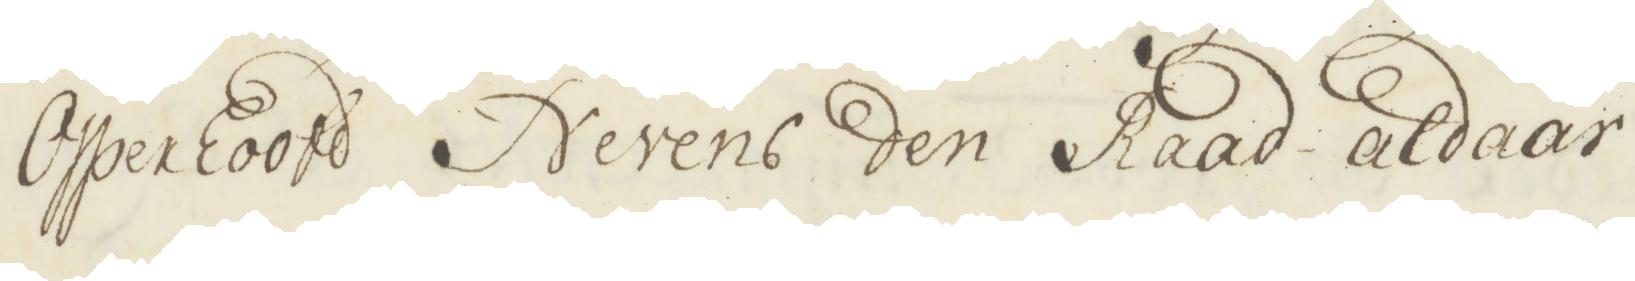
Opperhoofd Nevens den Raad -aldaar
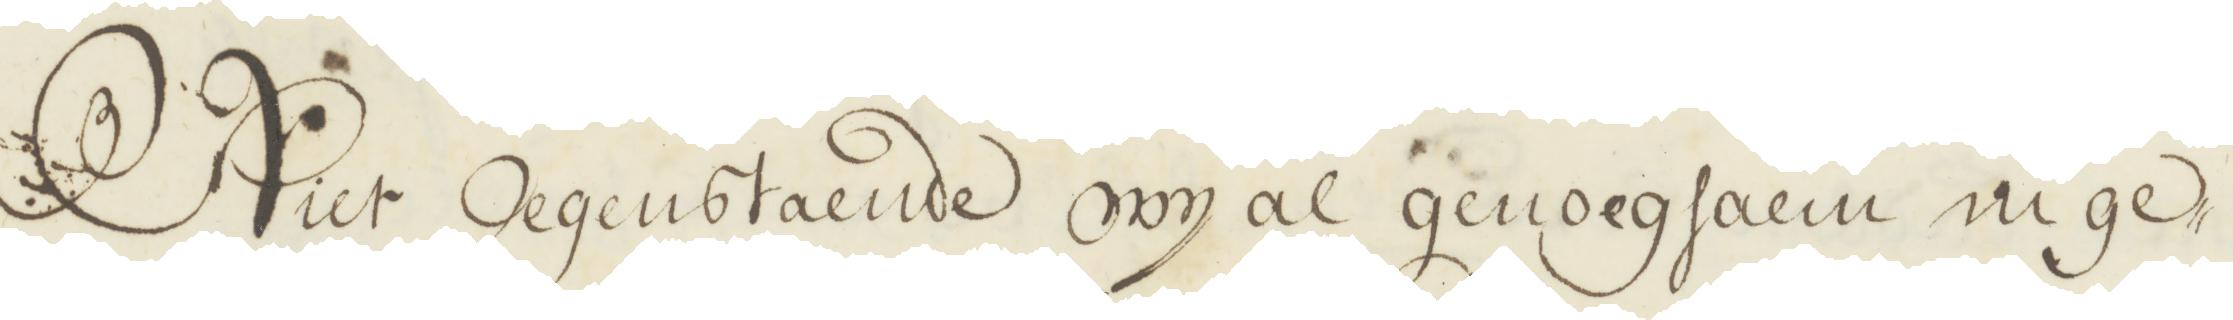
Niet Jegenstaende wy al genoegsaem in ge„
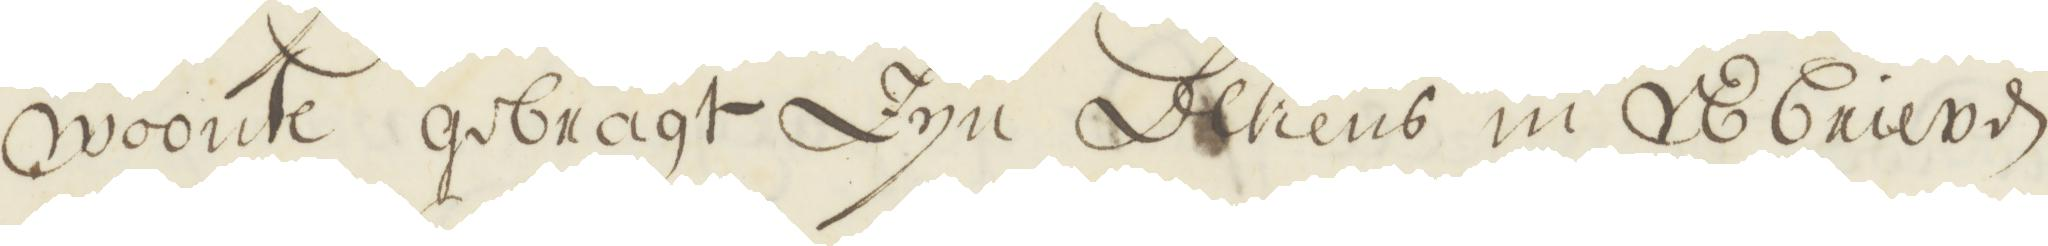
woonte gebragt Zyn telkens in VE brieven
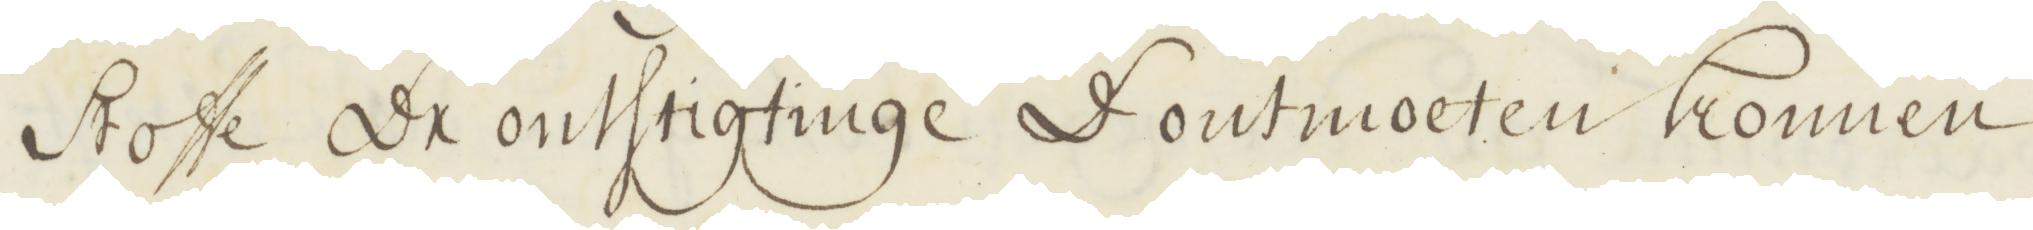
Stoffe ter ontstigtinge te ontmoeten konnen
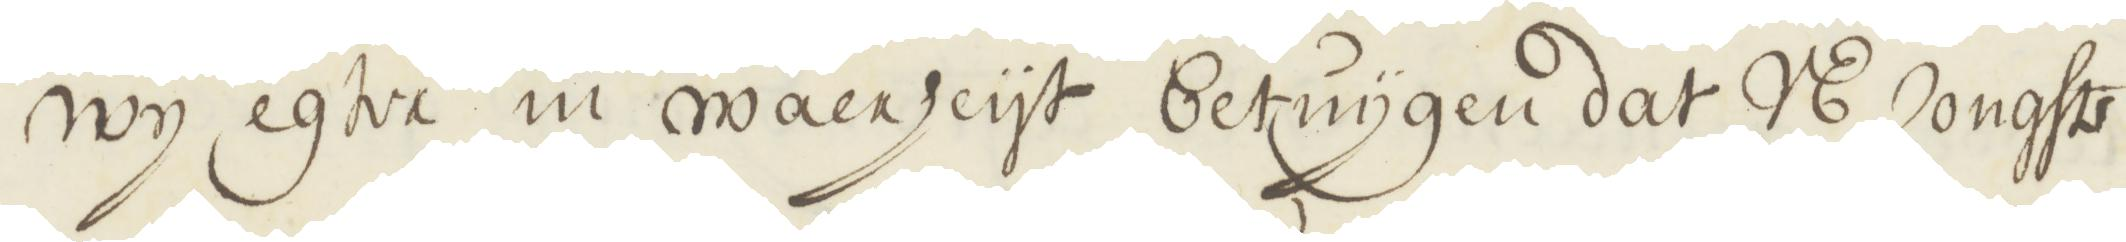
wy egter in waerheijt betuijgen dat VE Jongste
